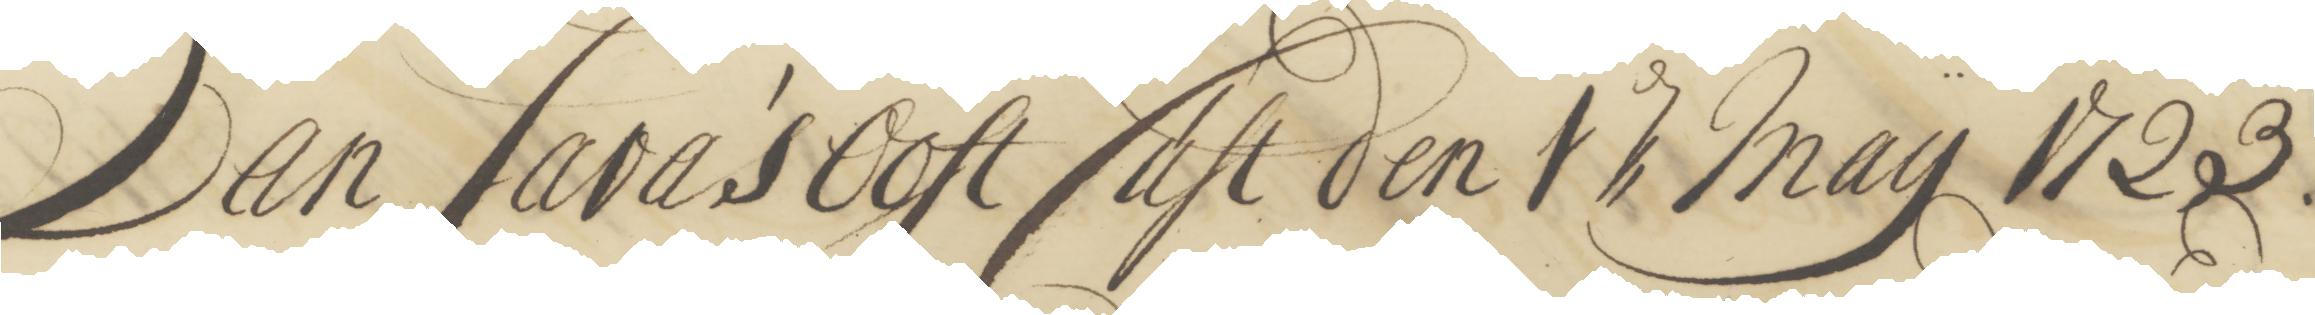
Van Java's Oost Cust den 17„ Maij 1723.
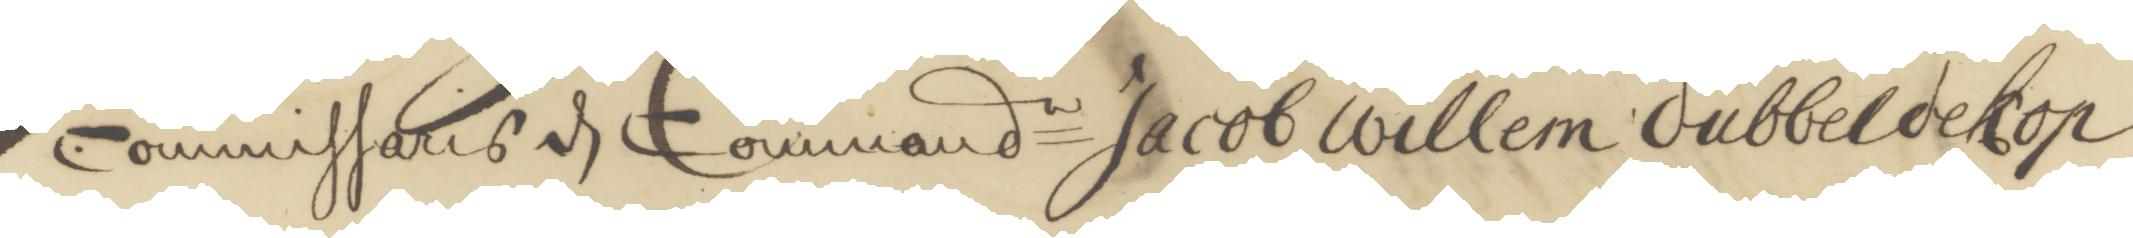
Commissaris en Command=r Jacob willem dubbeldekop
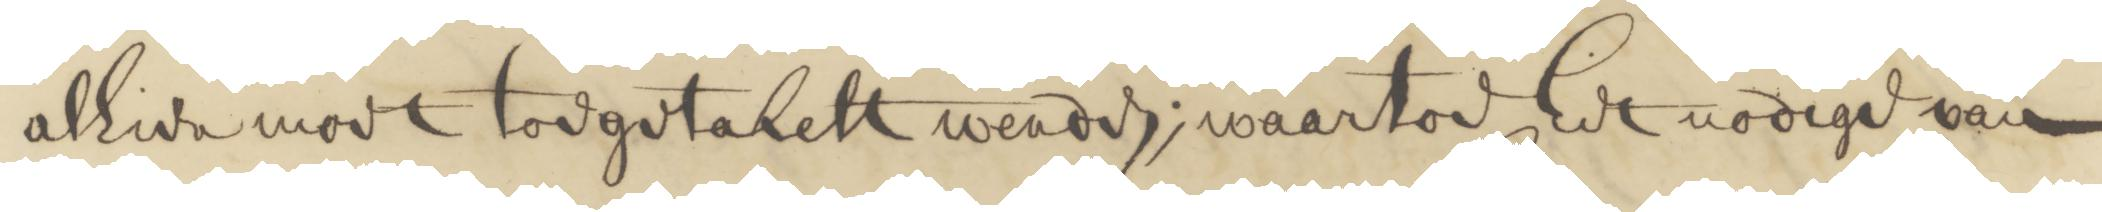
alhier moet toegetakelt werden; waartoe het nodige van
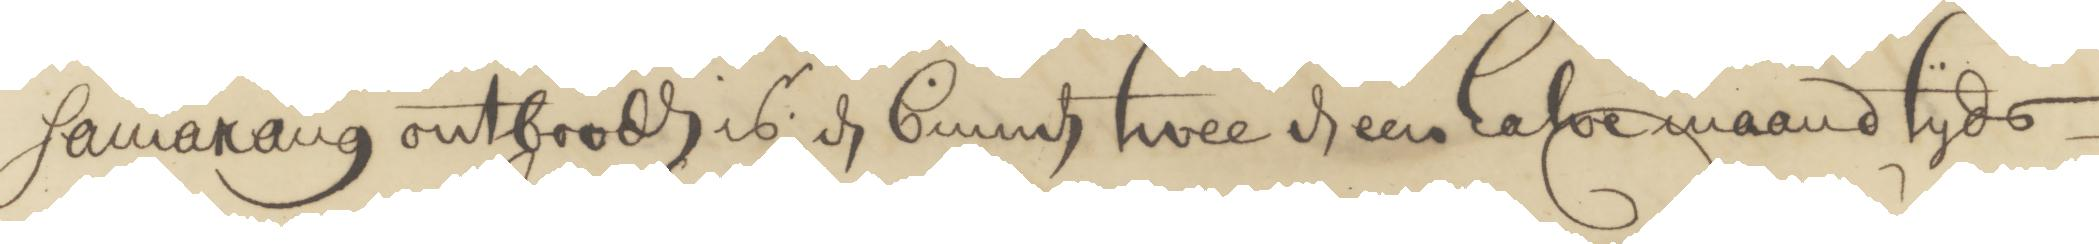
Samarang ontbooden is; en binnen twee en een halve maand tijds
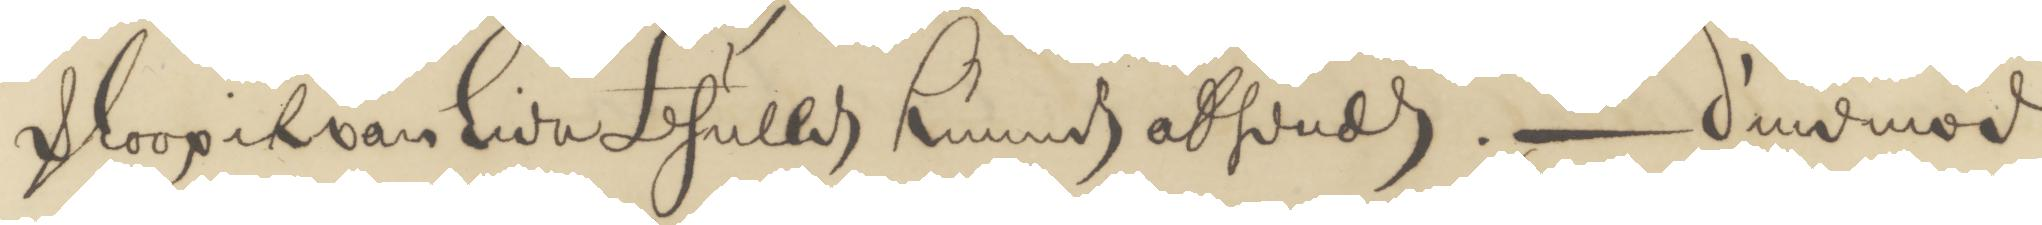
verhoop ik van hier te Sullen kunnen afsenden. — d' nieuwe
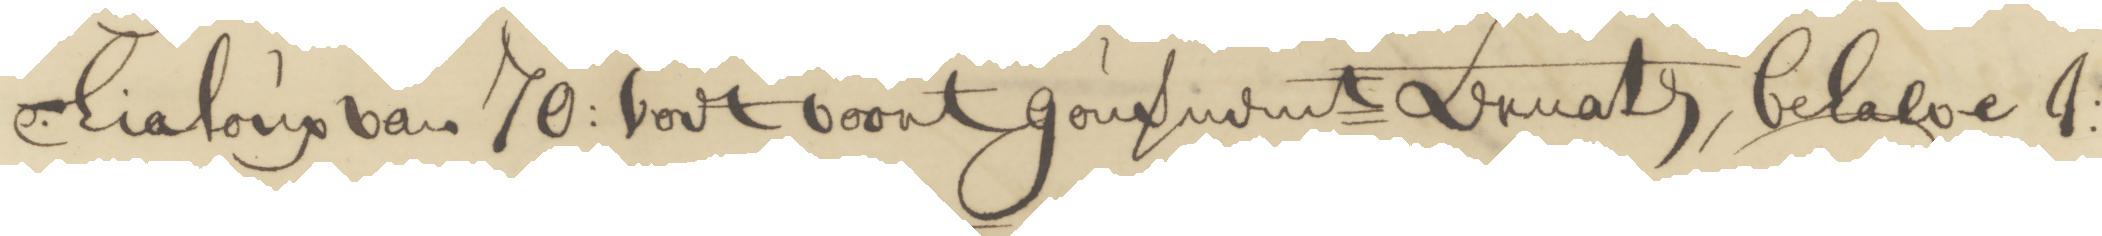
chialoup van 70: voet voor't gouvernem=t Ternaten, behalve 4:
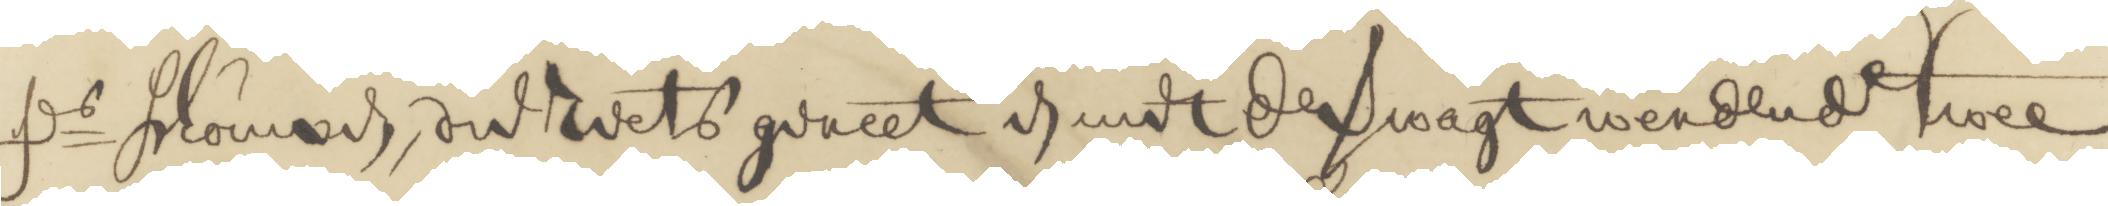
p=s Schouwen, die reets gereet en met de verwagt werden de twee
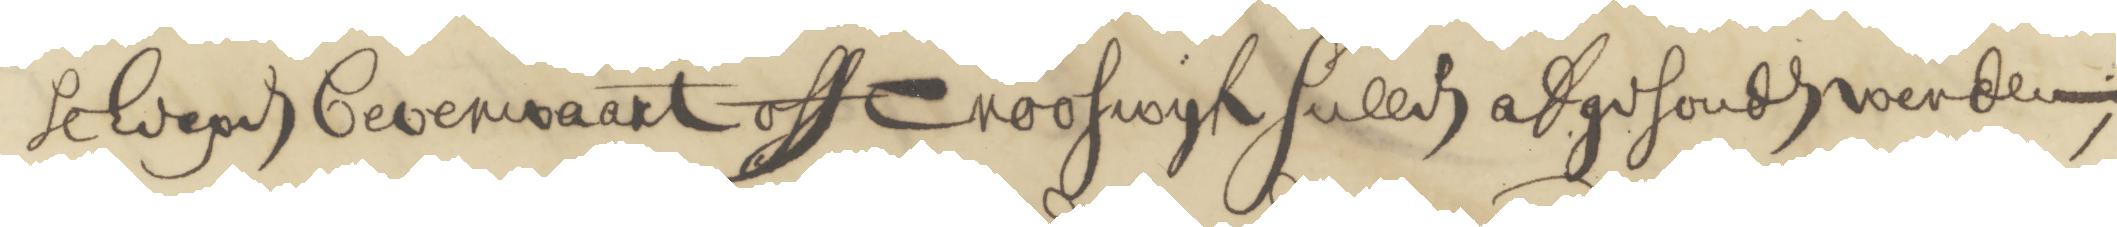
scheepen beverwaart off Crooswijk Sullen afgesonden werden;
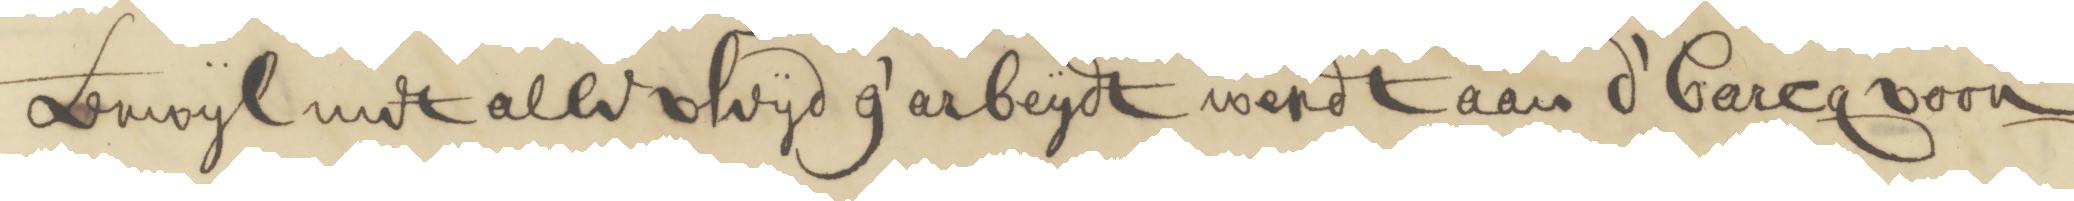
terwijl met alle vleijd g’arbeijdt werdt aan d’ barcq voor
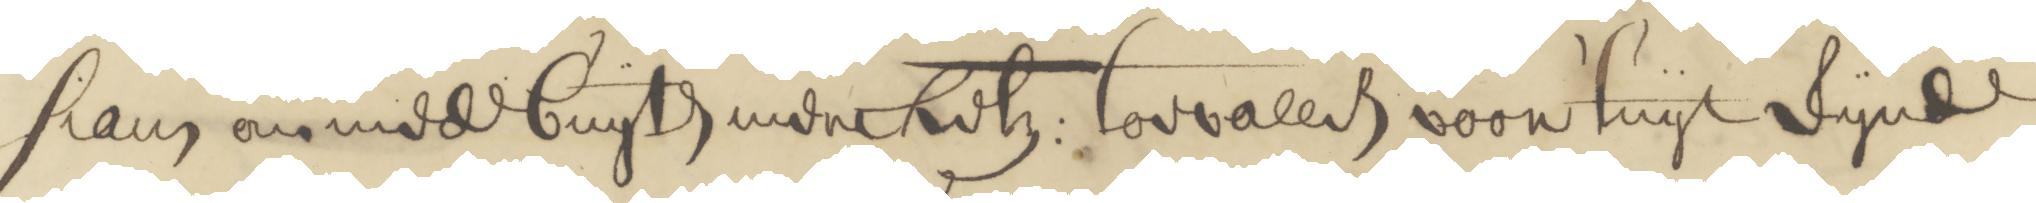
Siam om mede buijten merckelijke toevallen voor 't uijt Eijnde
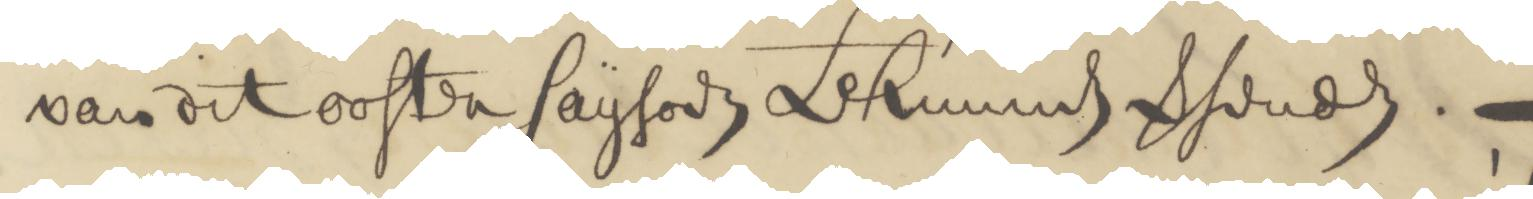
van dit ooster Saijsoen te kunnen versenden. —
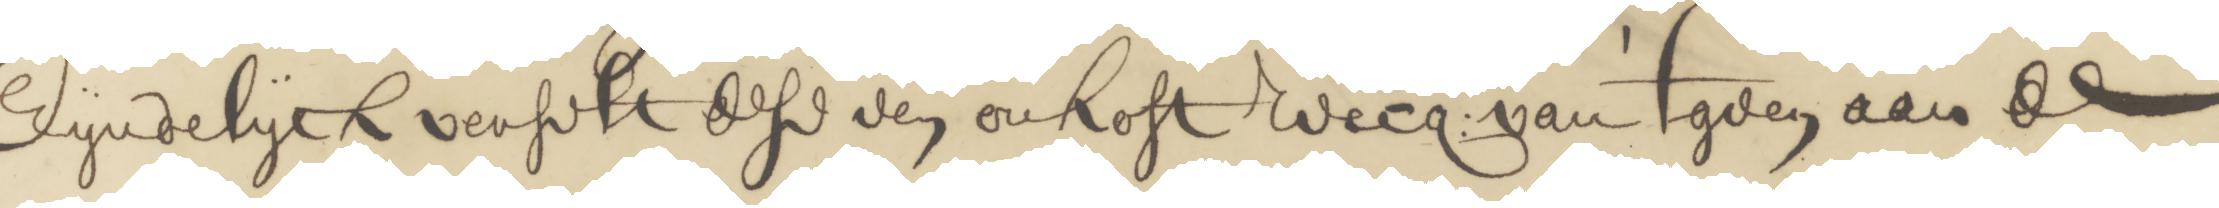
Eijndelijck verselt dese een onkost reecq: van 't geen aan de
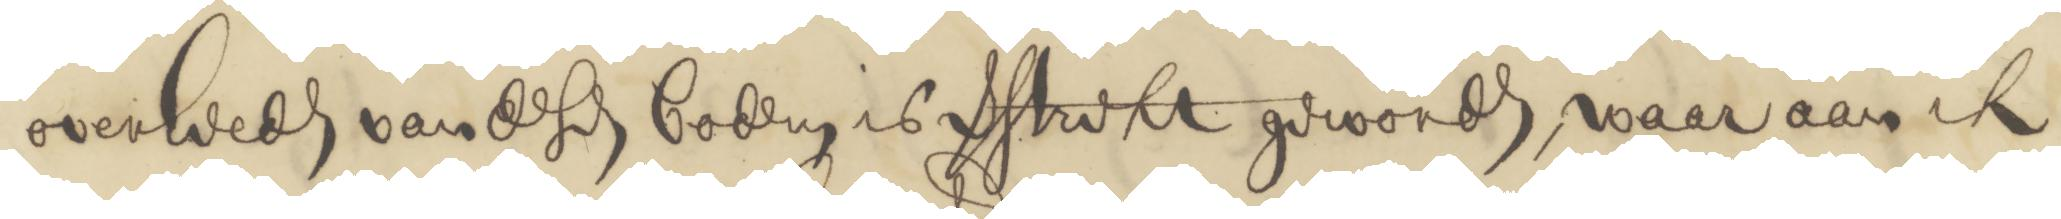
overheeden van desen bodem is verstrekt geworden, waaraan ik
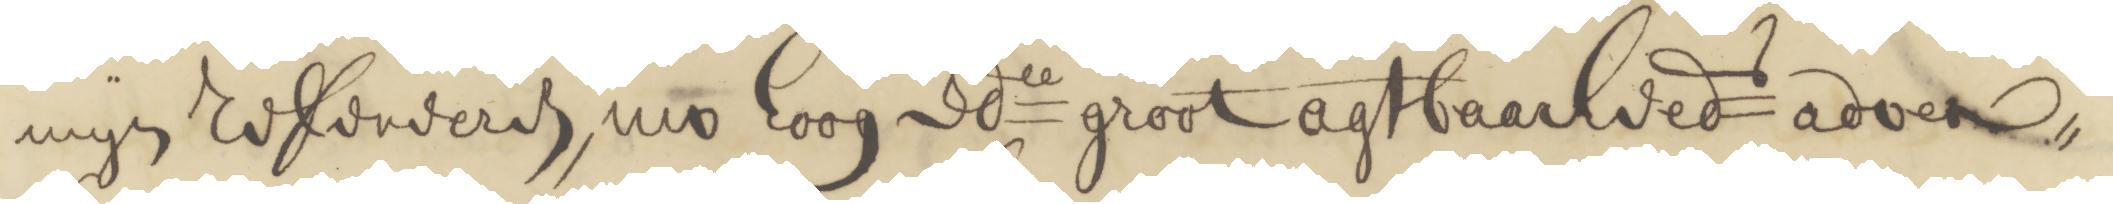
mijn refereeren, uw hoog Ed=le groot agtbaarheed=s adver„
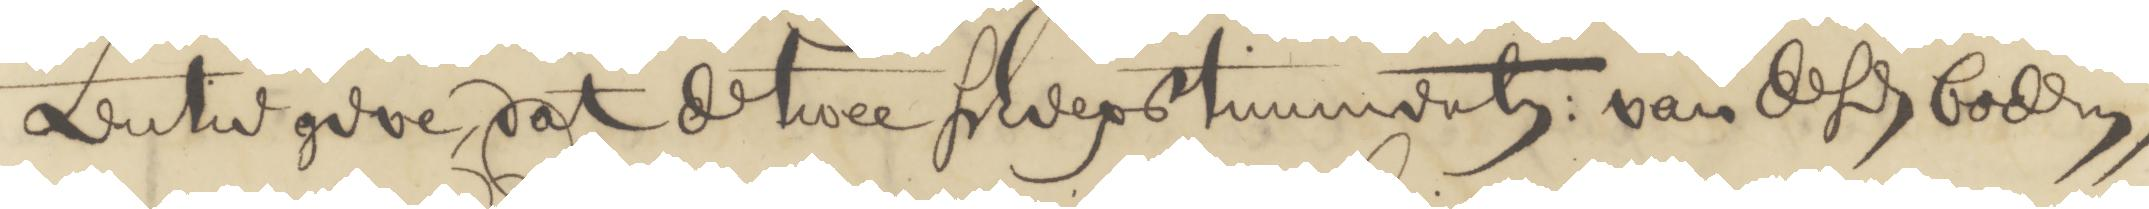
tentie geve, dat de twee scheepstimmerl: van desen bodem,
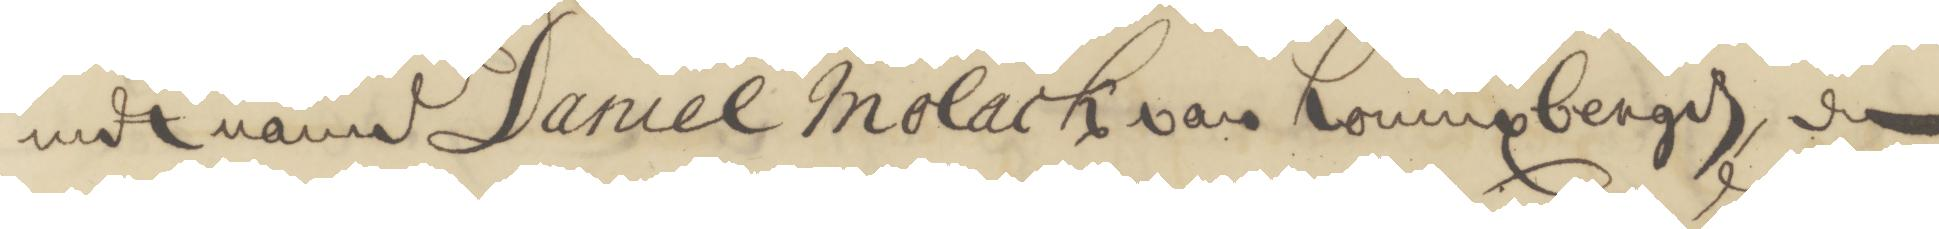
met name Daniel Molack van koninxbergen, en
